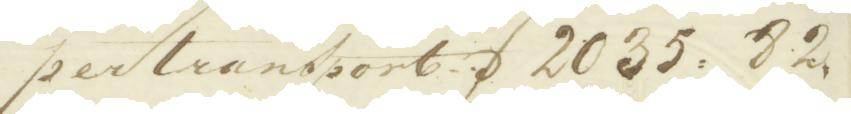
per transport ƒ2035: 82.
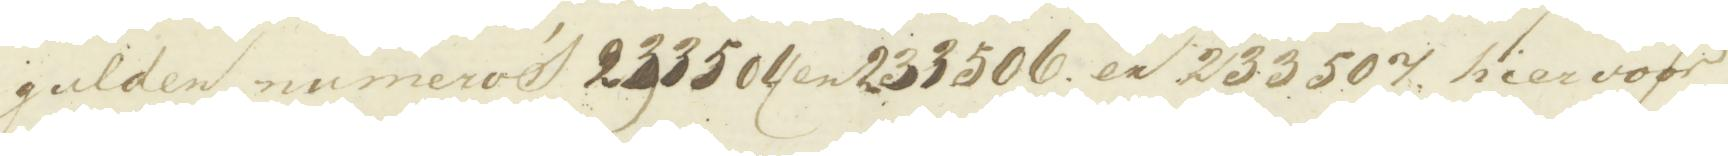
gulden, numero's 233504 en 233506 en 233507, hier voor
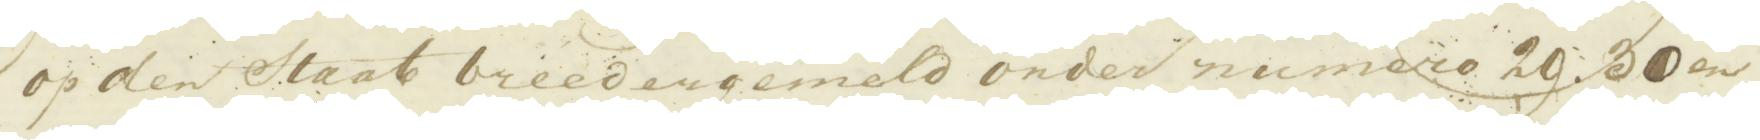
op den staat breedergemeld onder numero 29.30 en
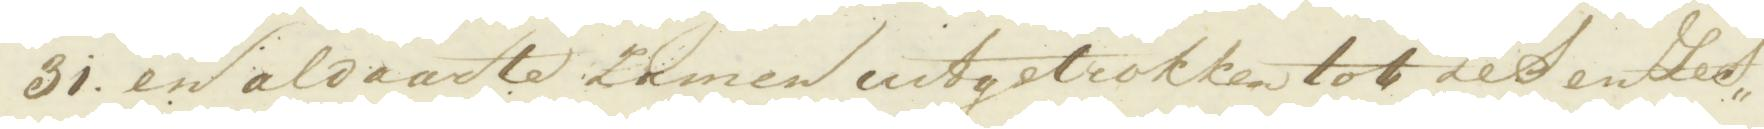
31. en aldaar te zamen uitgetrokken tot zes en zes„
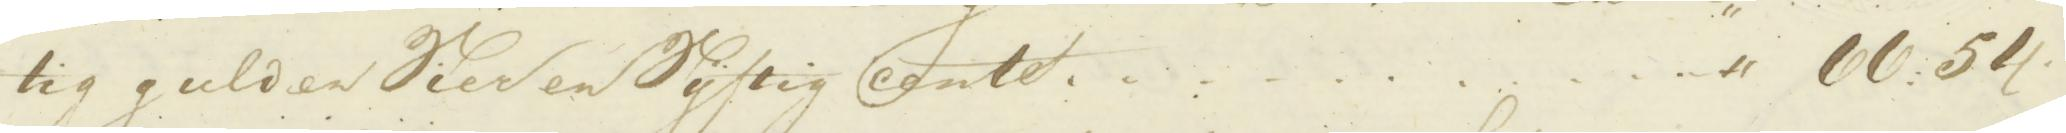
tig gulden Vier en Vijftig cents. . . . . . . . . . . „ 66:54.
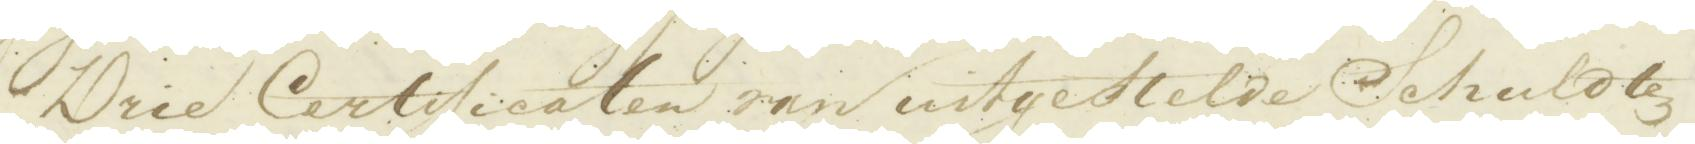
Drie Certificaten van uitgestelde schuld ten
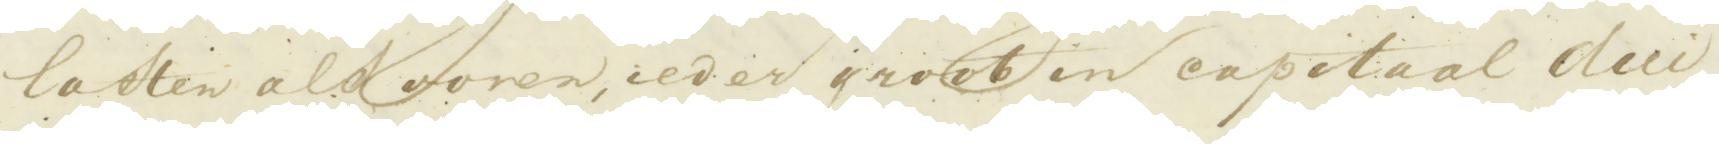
lasten als voren, ieder groot in capitaal dui
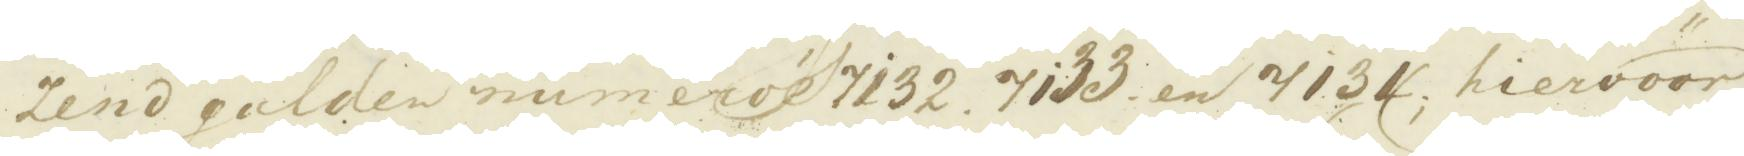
zend gulden numero's 7132. 7133 en 7134; hiervoor
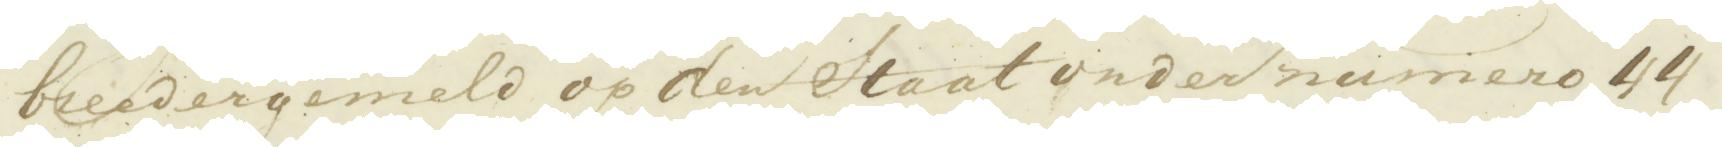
breedergemeld op den staat onder numero 44
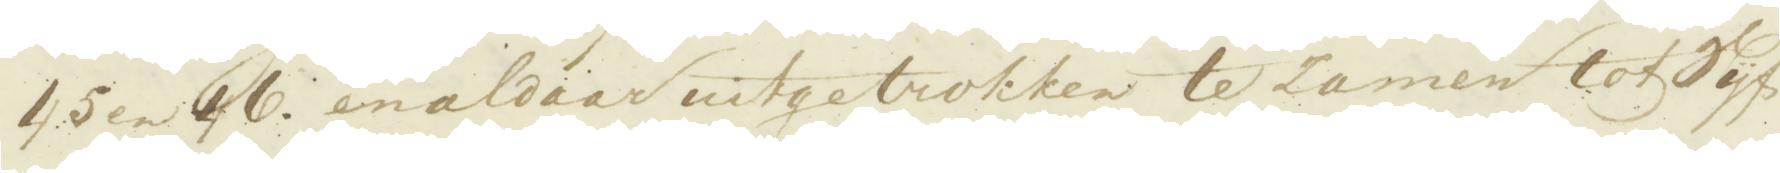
45 en 46. en aldaar uitgetrokken te zamen tot Vijf
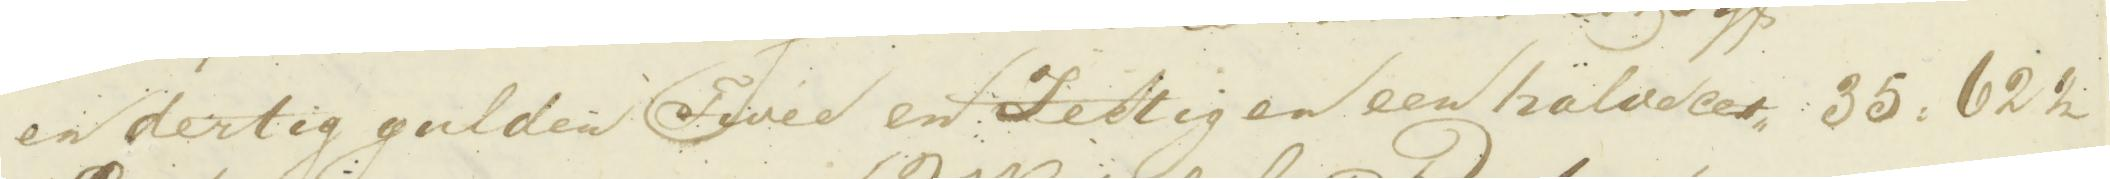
en dertig gulden Twee en Zestig en en een halve cet„ :35: 62 2
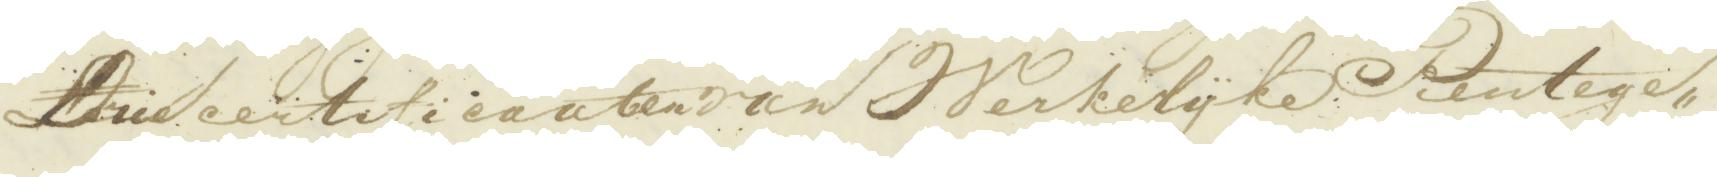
Drie certiticaaten van Werkelijke Rentege„
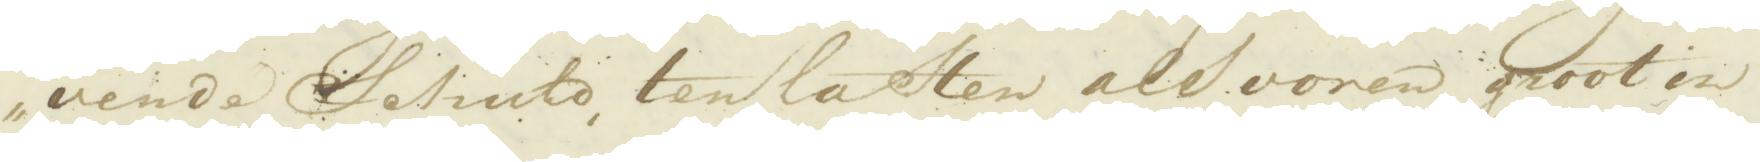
vende schuld, ten lasten als voren, groot in
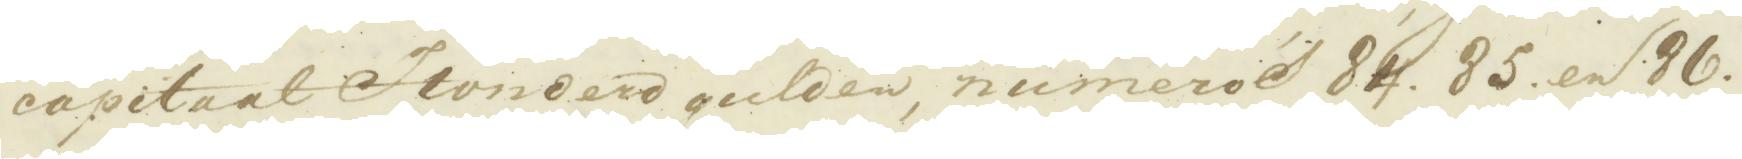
capitaal Honderd gulden, numero's 84. 85. en 86.
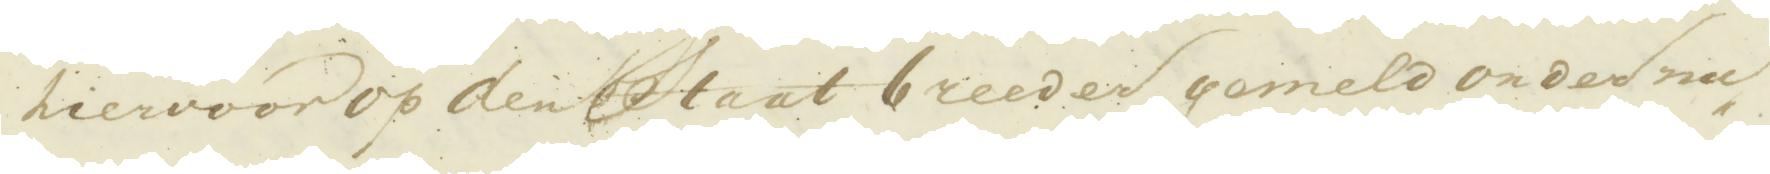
hiervoor op den staat breeder gemeld onder nu„
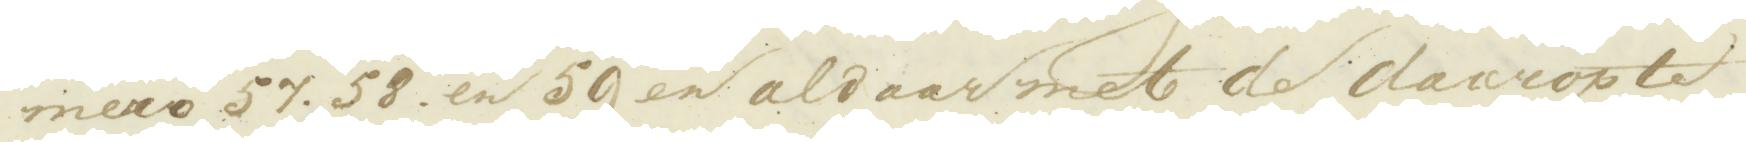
mero 57. 58. en 59 en aldaar met de daarop te
